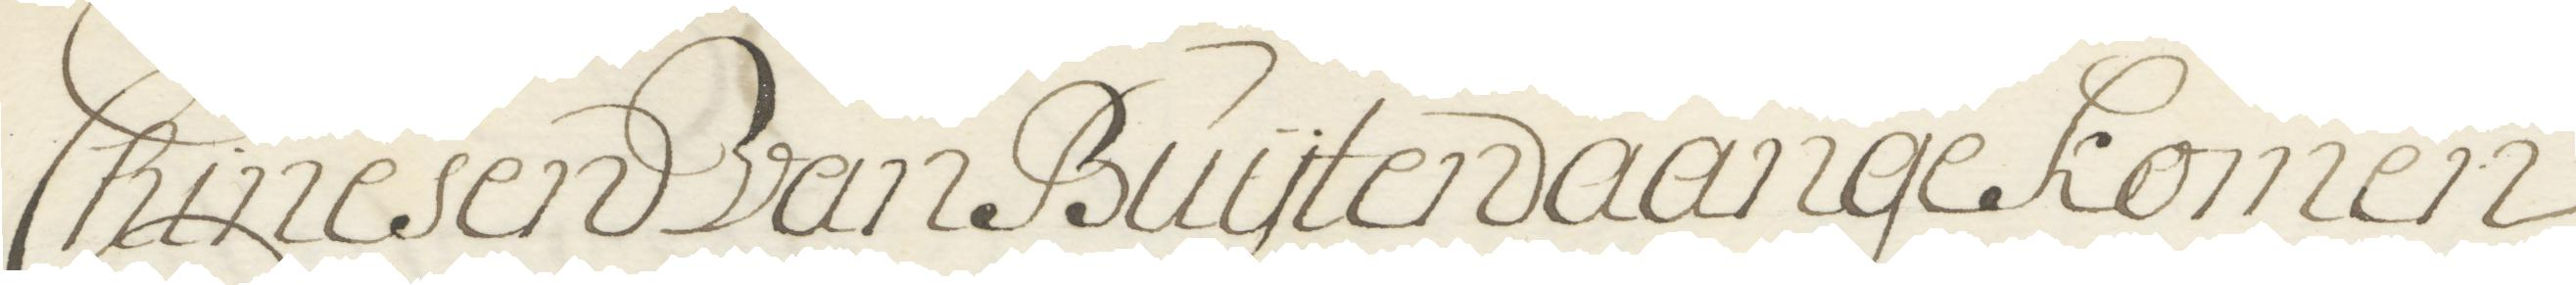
Chinesen van Buijten aangekomen
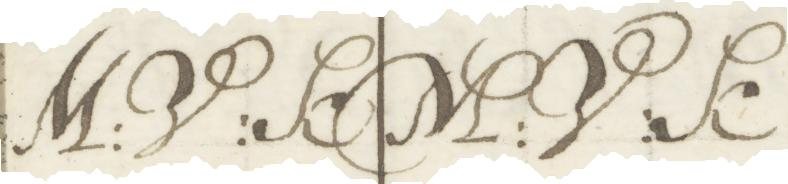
M: V: K M: V: K
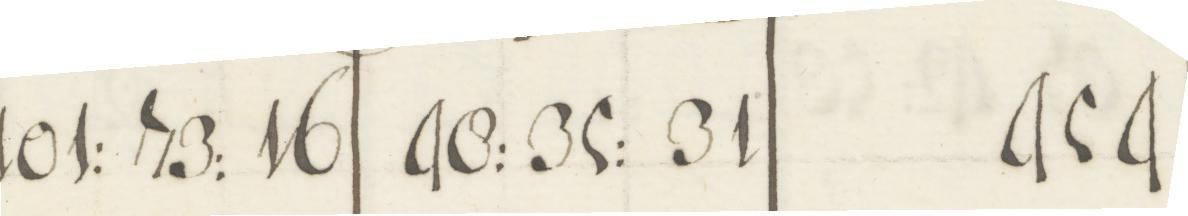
101: 73: 16 48: 35: 31 454
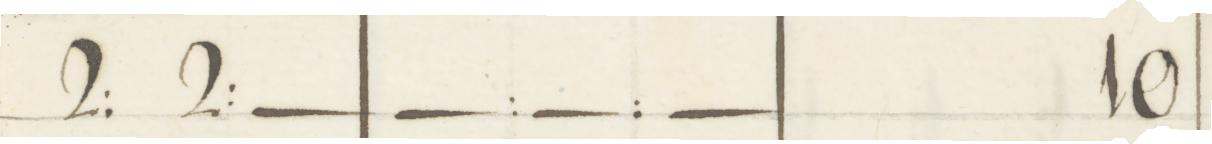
2: 2: — —:—:— 10
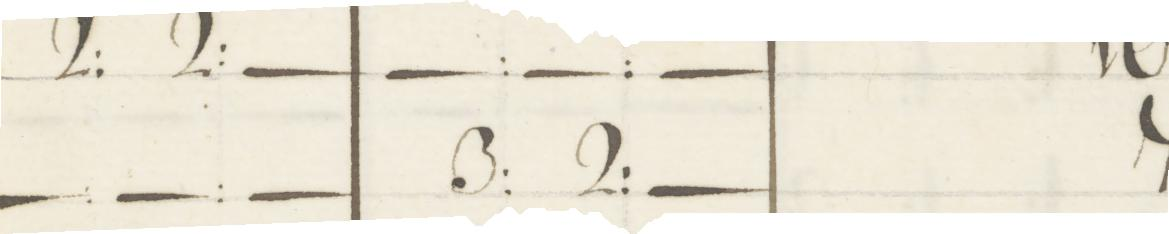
—:—:— 3: 2:— 7
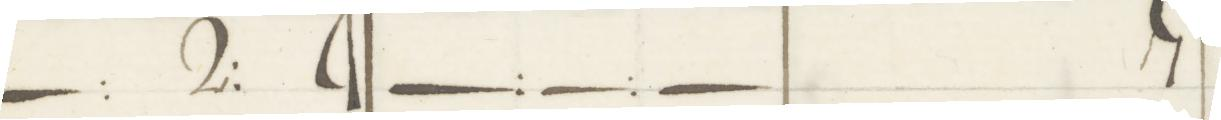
—: 2: 4 —:—:— 7
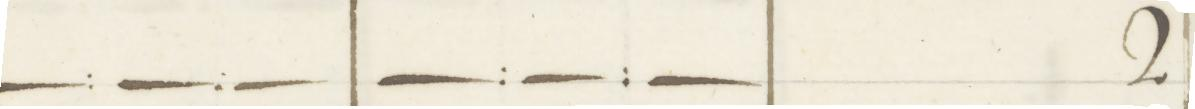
—:—:— —:—:— 2
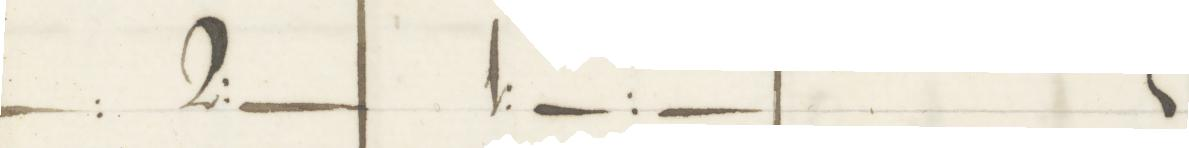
—: 2:— 1:—:— 5
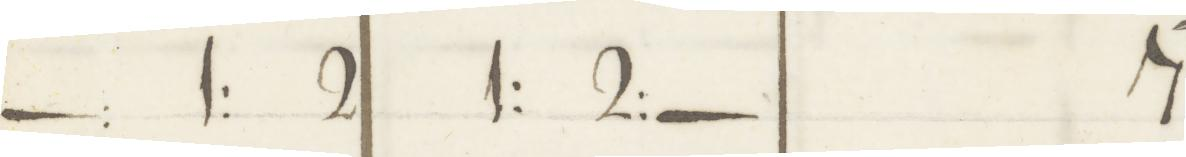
—: 1: 2 1: 2:— 7
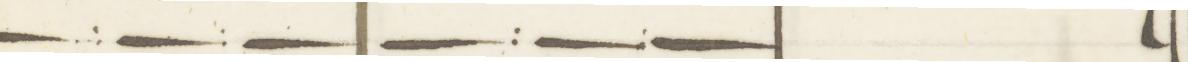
—:—:— —:—:— 4
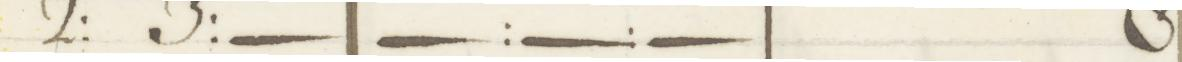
2: 3:— —:—:— 8
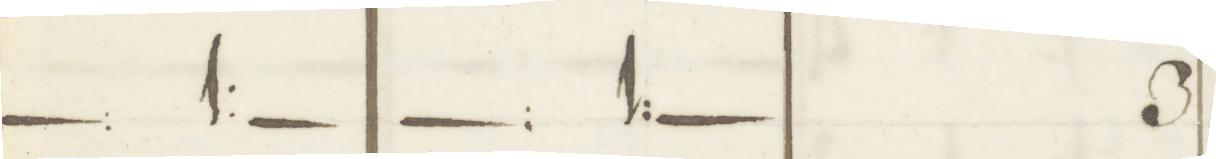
—: 1:— —: 1:— 3
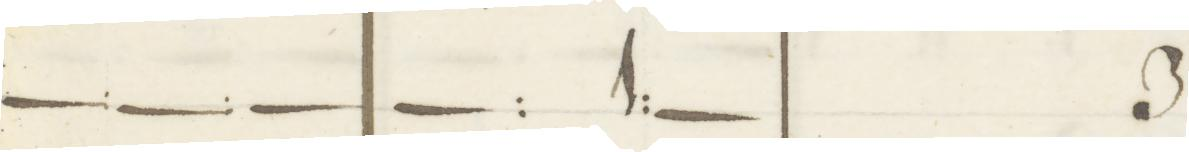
—:—:— —: 1: — 3
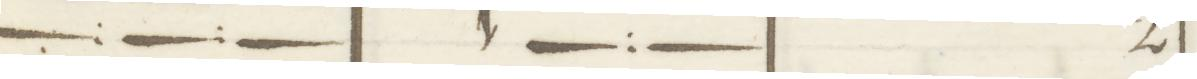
—:—:— 1—:— 2
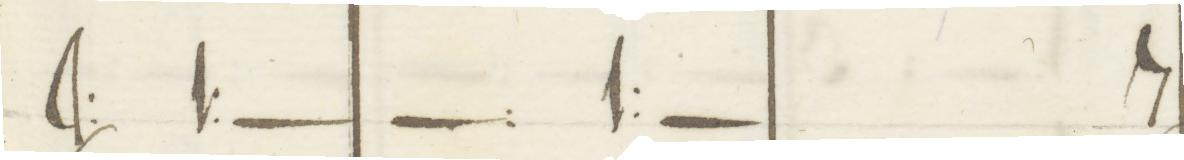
4: 1:— —: 1:— 7
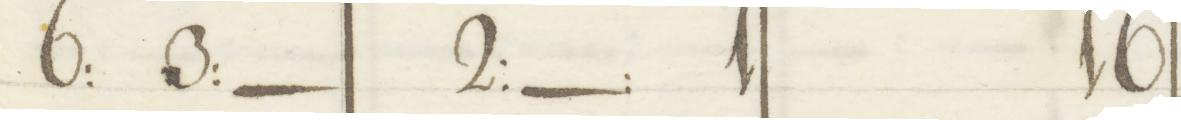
6: 3:— 2:—: 1 16
